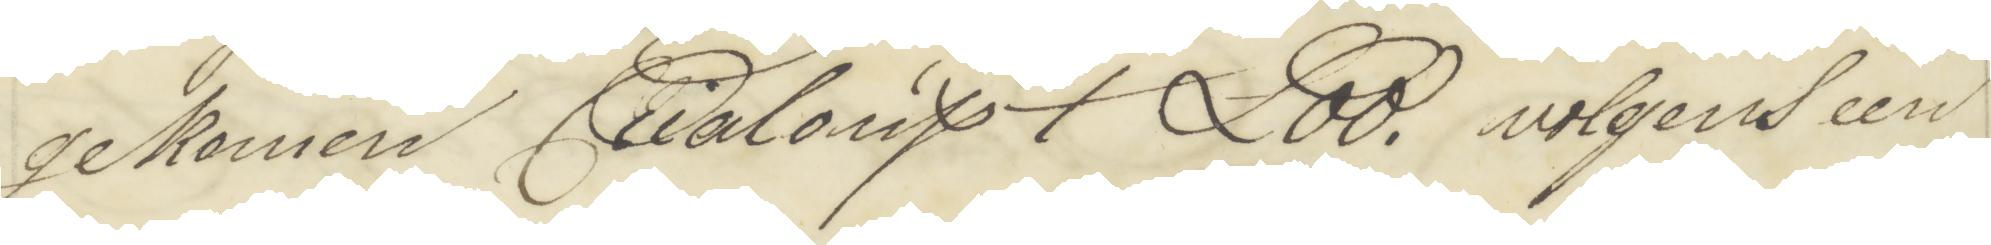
gekomen Chialoup ’t Loo. volgens een
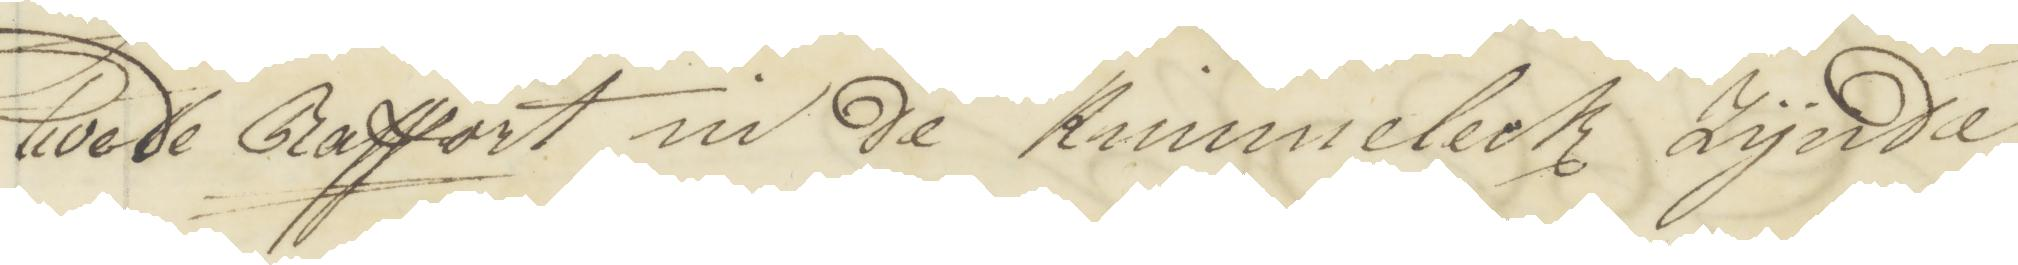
twede Rapport in de kimmeleck zijnde
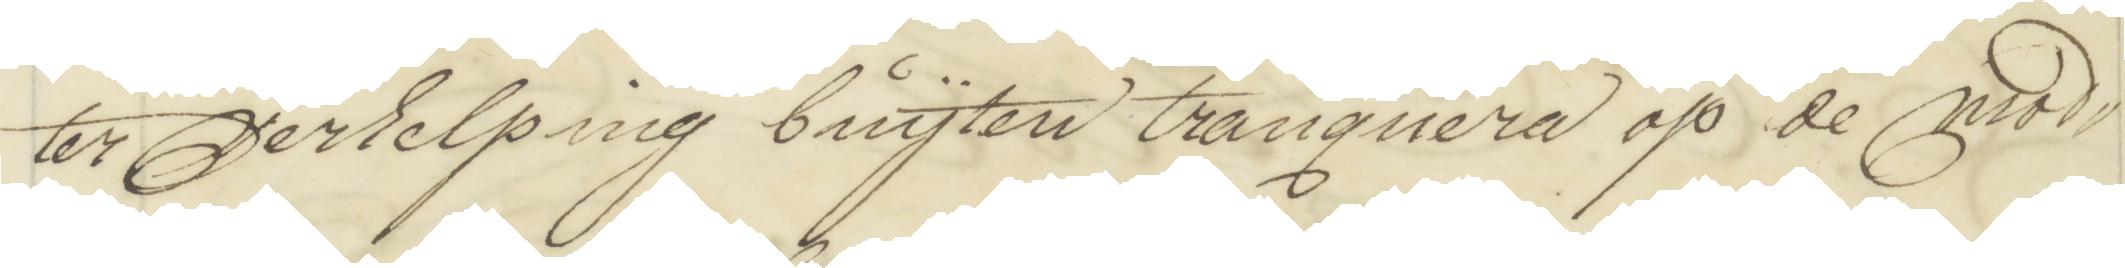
ter verhelping buijten tranquera op de mod„
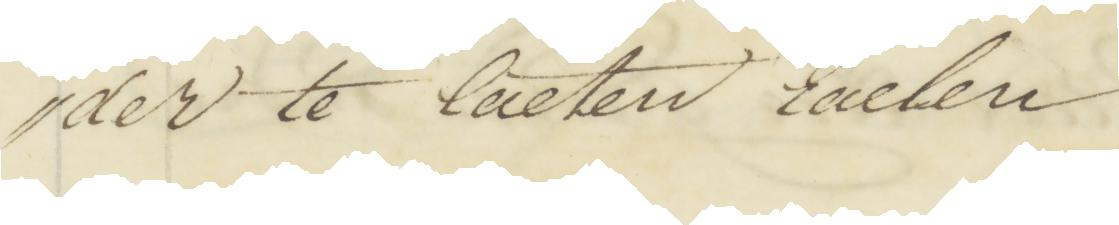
„der te laeten haelen
